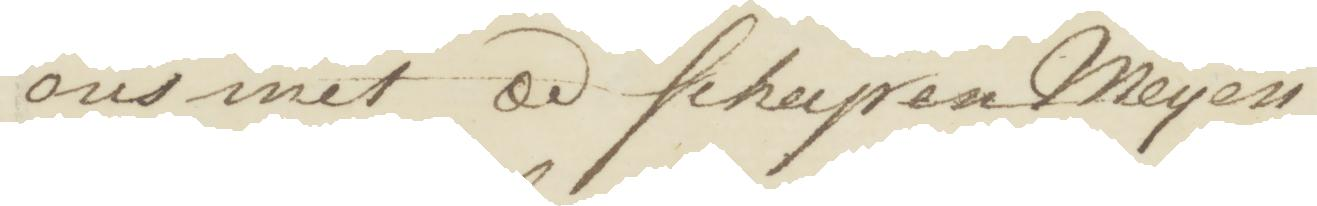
ons met de Scheepen Meijen
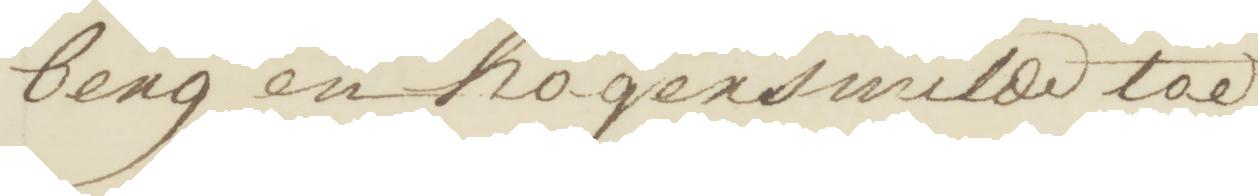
berg en Hogersmilde toe
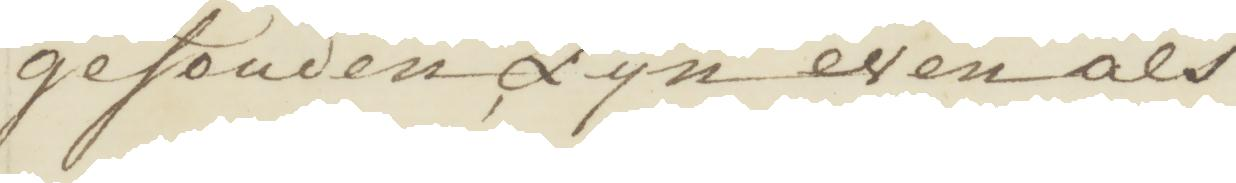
gesonden, Zijn even als
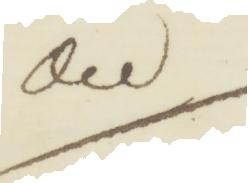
die ./.
